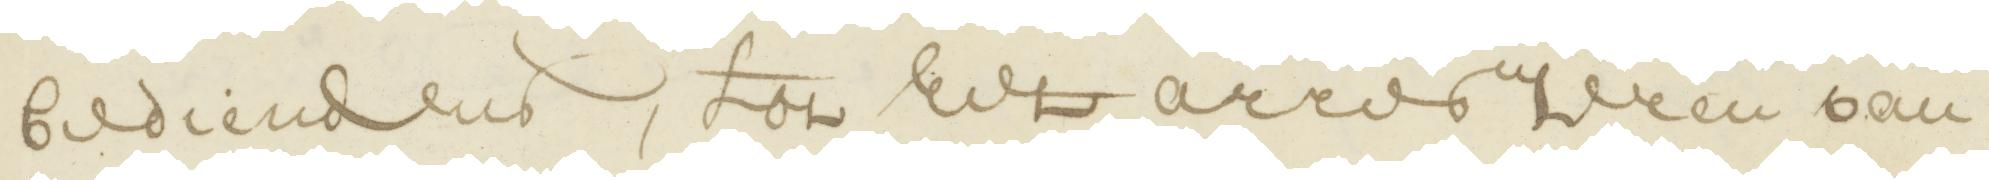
bediendens, tot het arresteren van
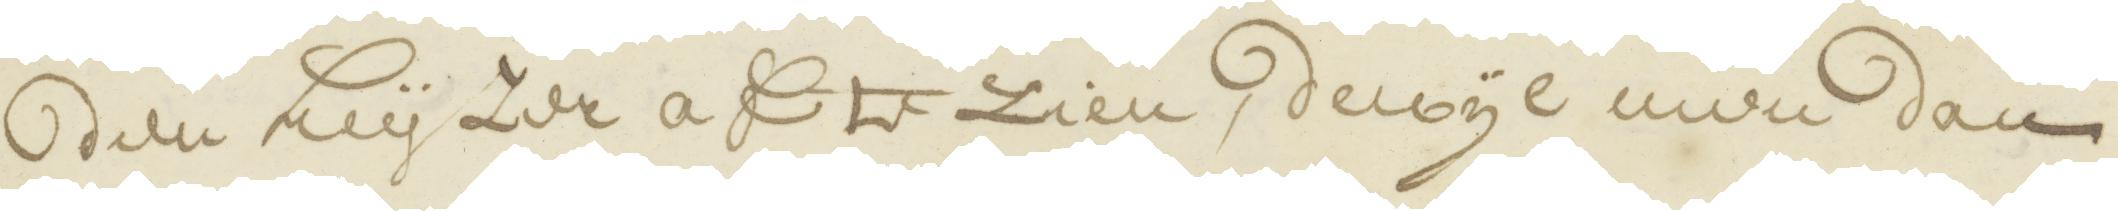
den keijzer afte zien, dewijl men dan
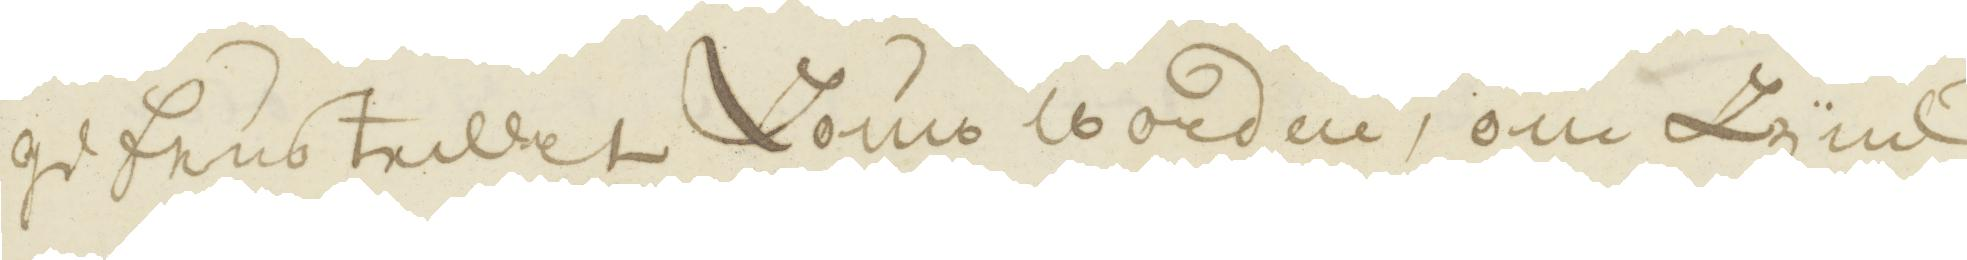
gefrustreert Zouw worden, om Zijne
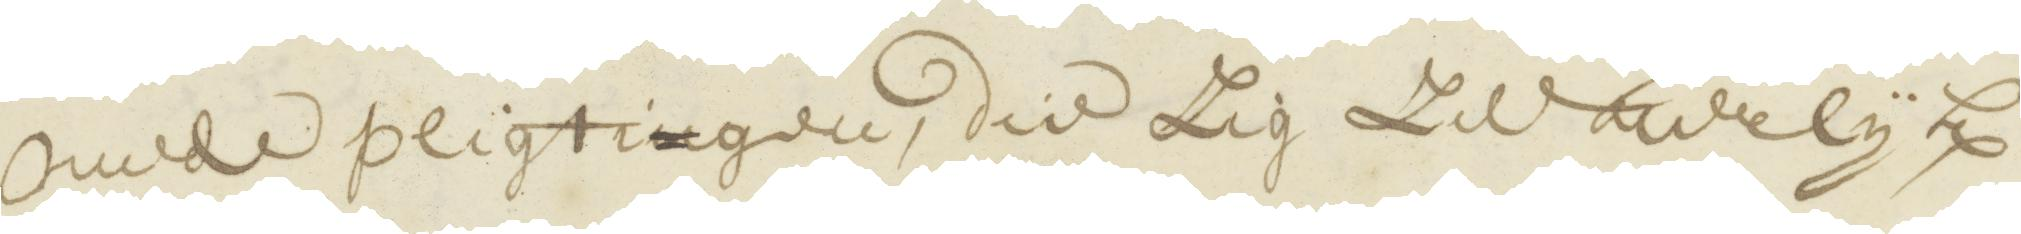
mede pligtingen, die Zig zeekerlijk
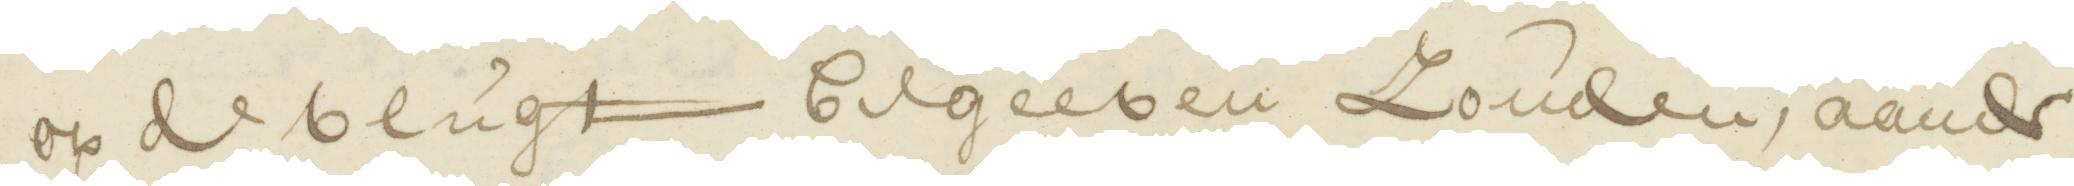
op de vlugt begeeven Zouden, aande
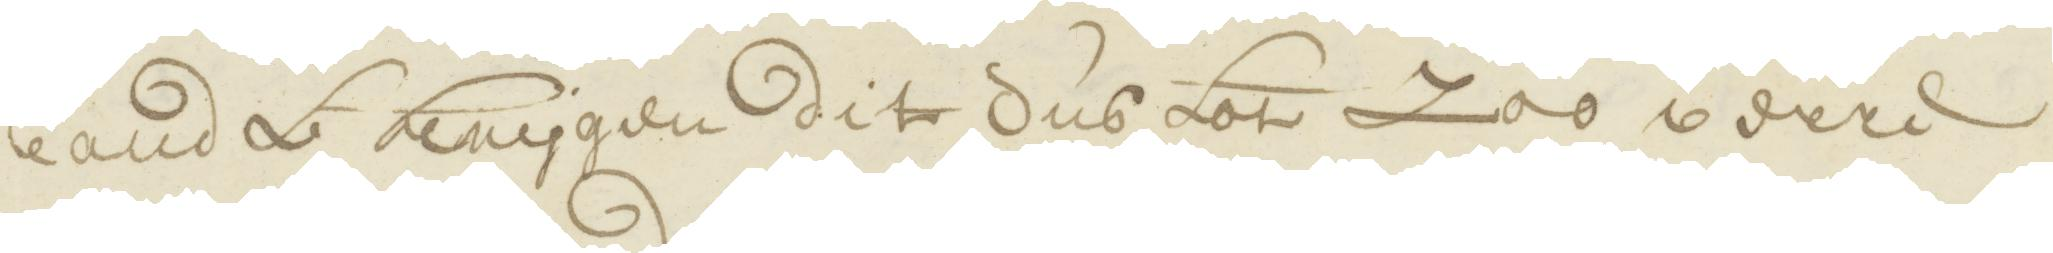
hand te krijgen dit dus tot Zoo verre
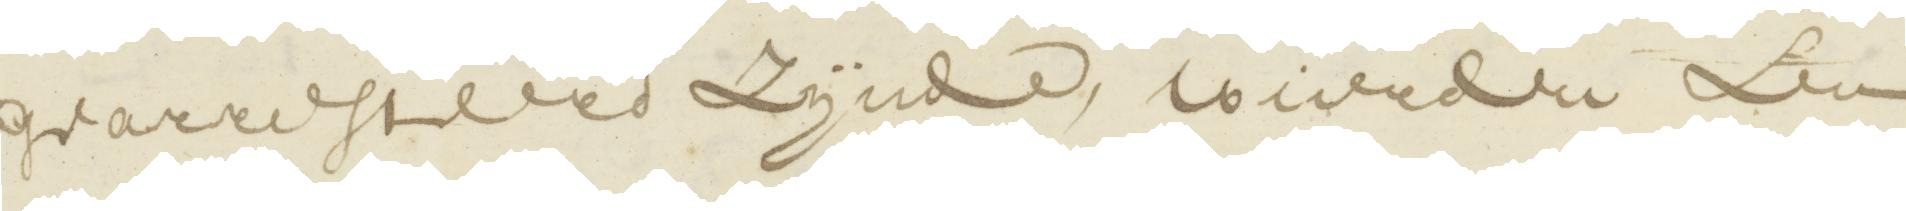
gearresteerd Zijnde, wierden ten
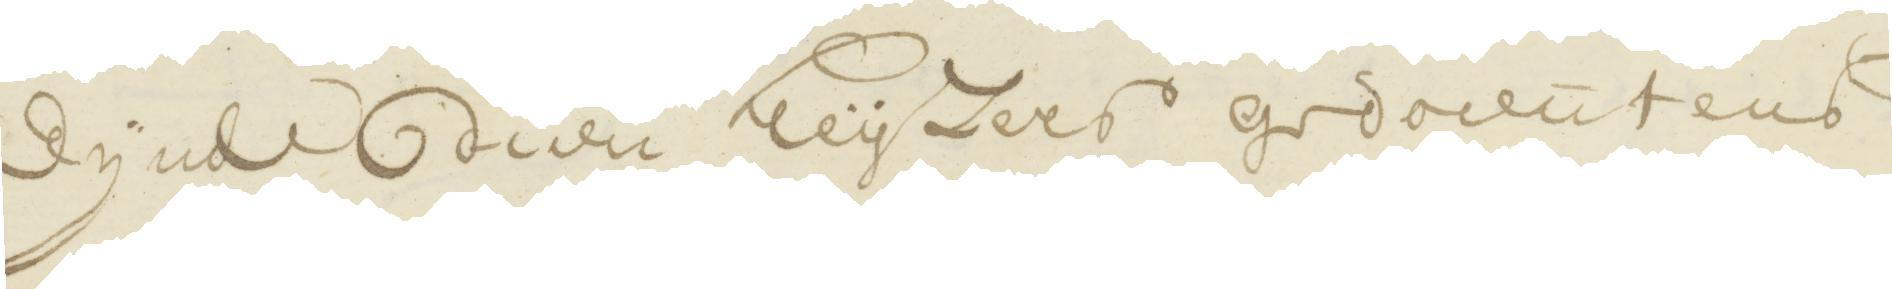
Eijnde dien keijzers gedoentens
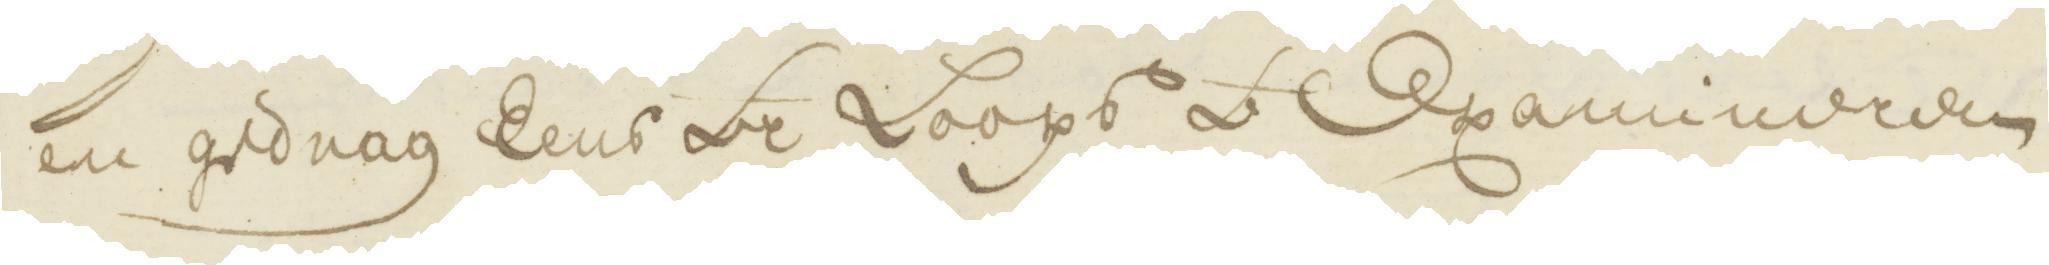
en gedrag Eens ter Loops te Examineren
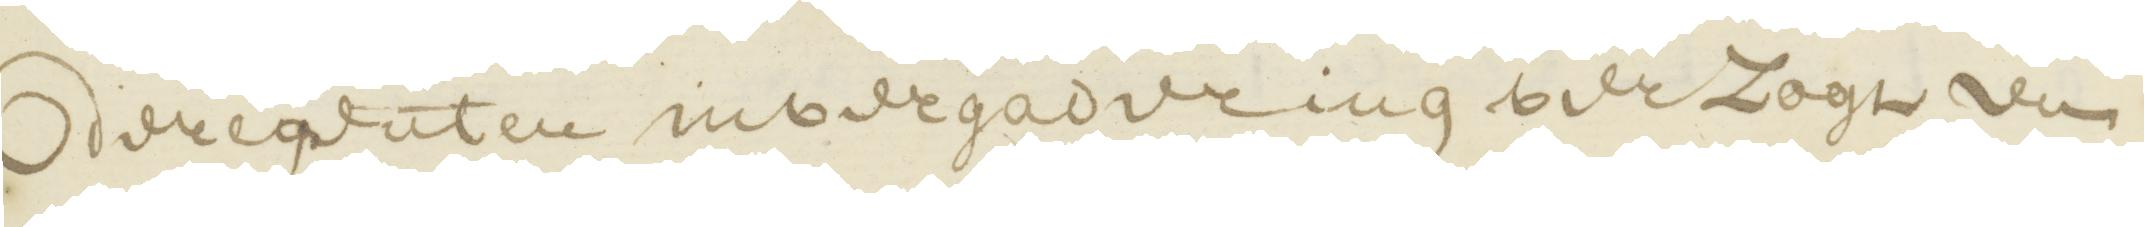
de regenten in vergadering verzogt en
